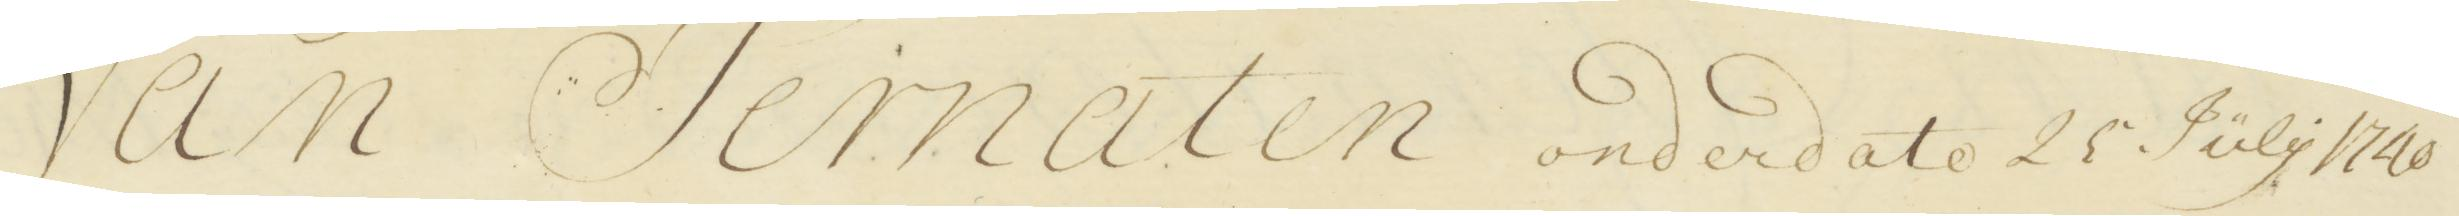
Van Ternaten onderdato 25. Iulij 1740
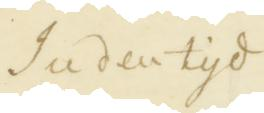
In den tijd
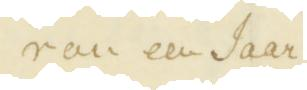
van een Iaar
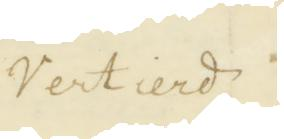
Vertierd
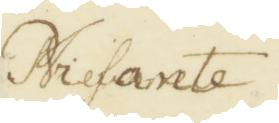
Presente
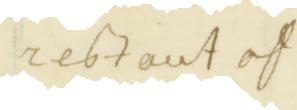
restant of
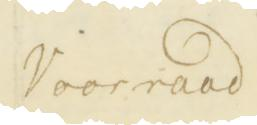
Voorraad
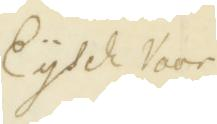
Eijsch voor
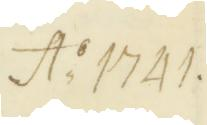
A„o 1741
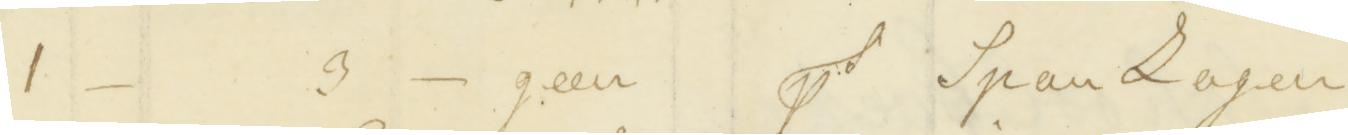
1 — 3 — geen p:s Span Zagen
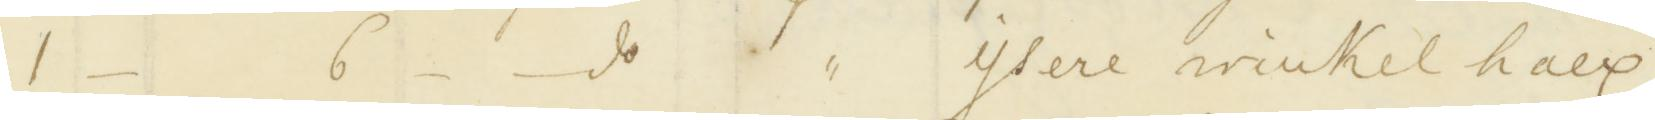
1 — 6 — do „ ijsere winkel haex
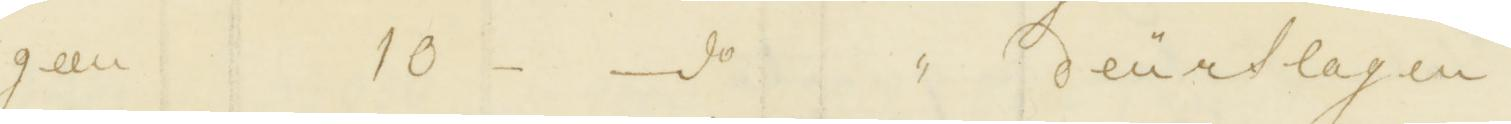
geen 10 — do „ deurslagen
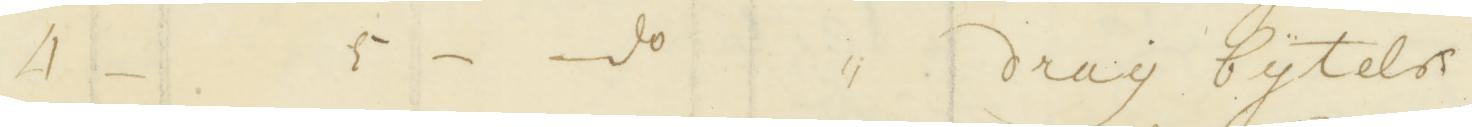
4 — 5 — do „ draij bijtels
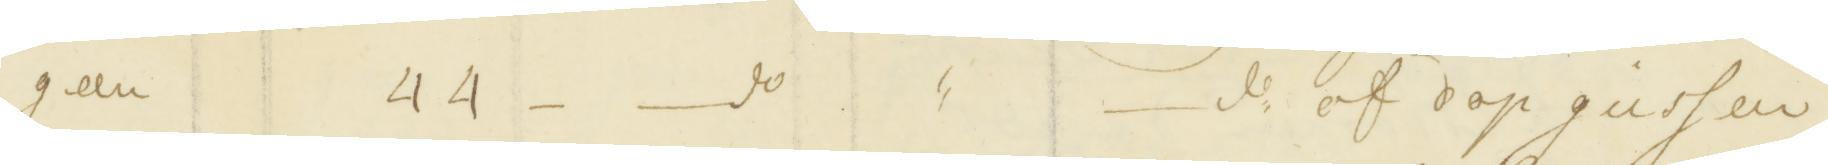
geen 44 — do „ d„o of dop gussen
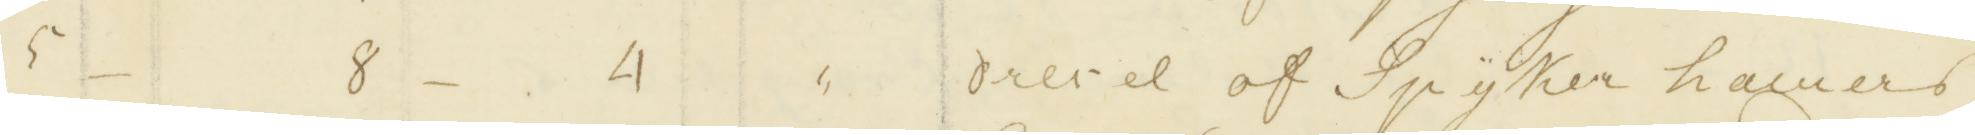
5 — 8 — 4 drevel of spijker hamers
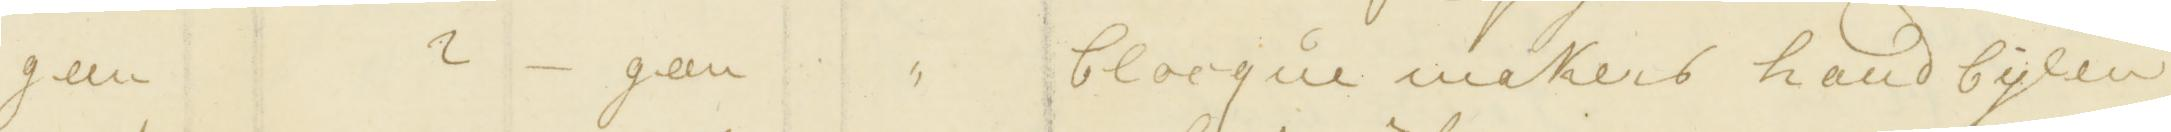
geen 2 — geen „ blocque makers hand bijlen
